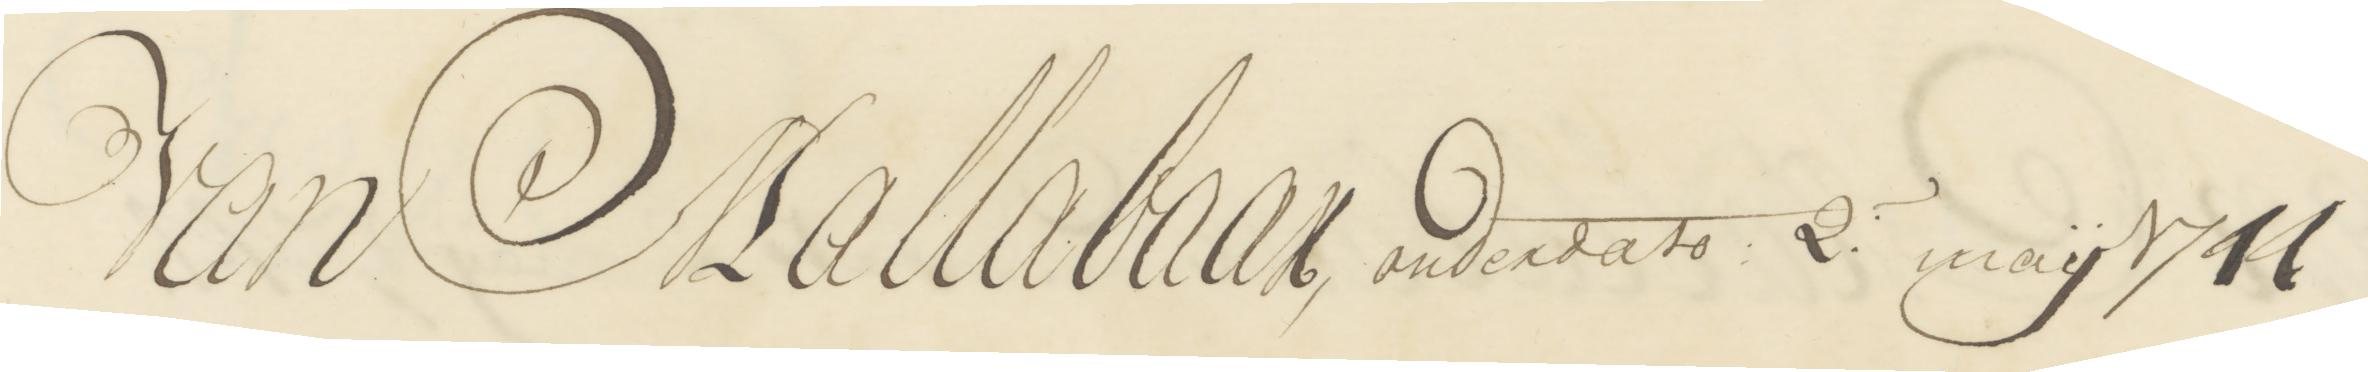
Van Mallabaar, onder dato 2:' maij 1744
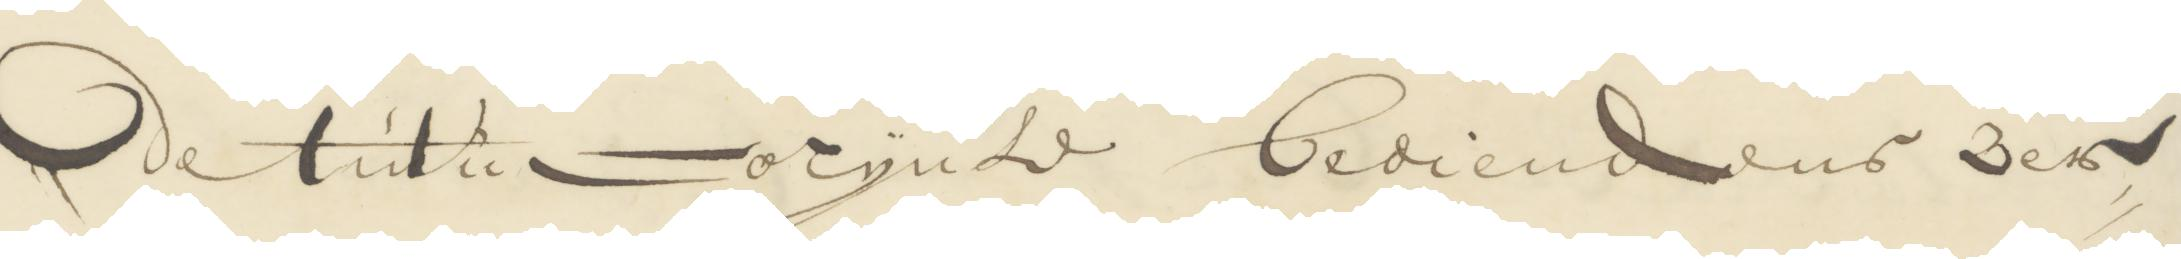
de tutucorijnse bediendens ver„
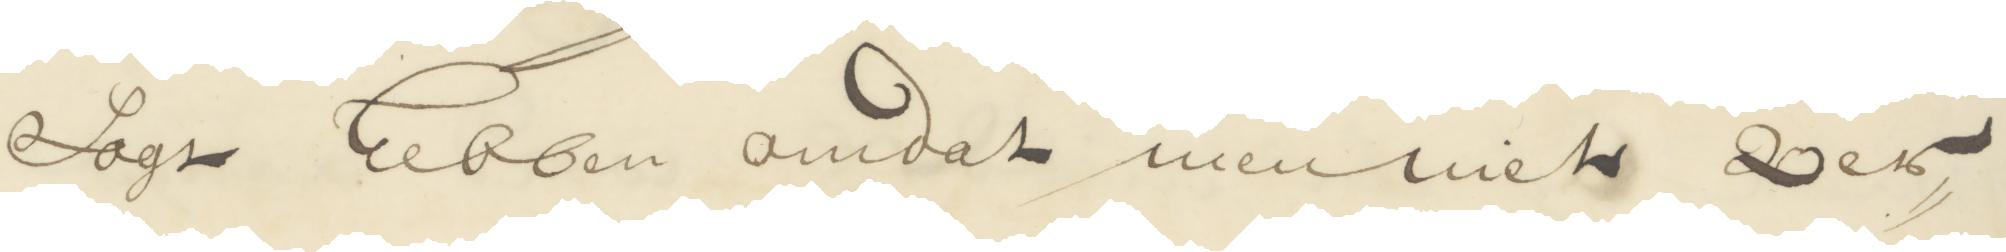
sogt hebben omdat men niet ver„
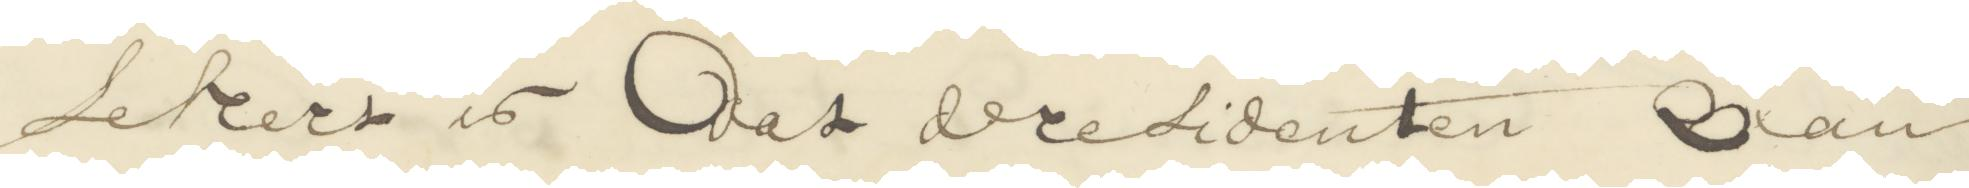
sekert is dat deresidenten van
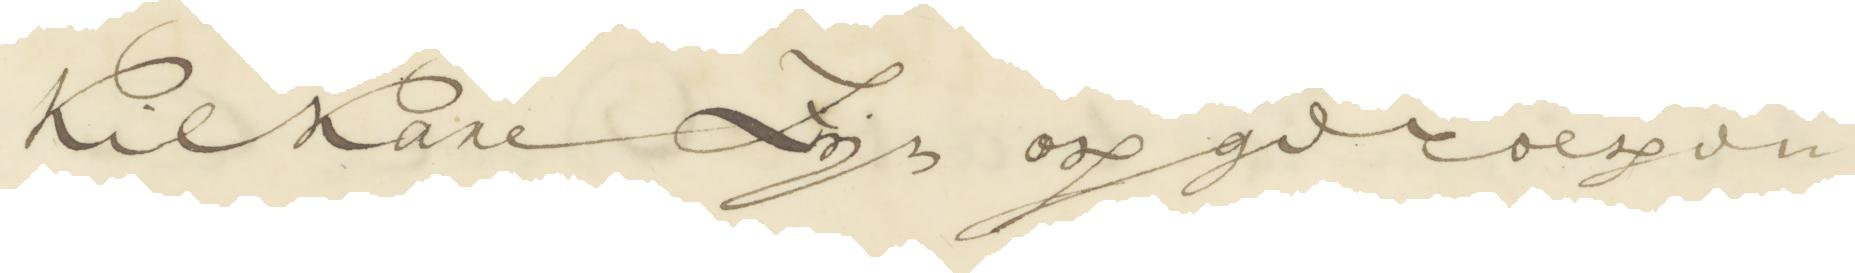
Kilkare zijn opgeroepen
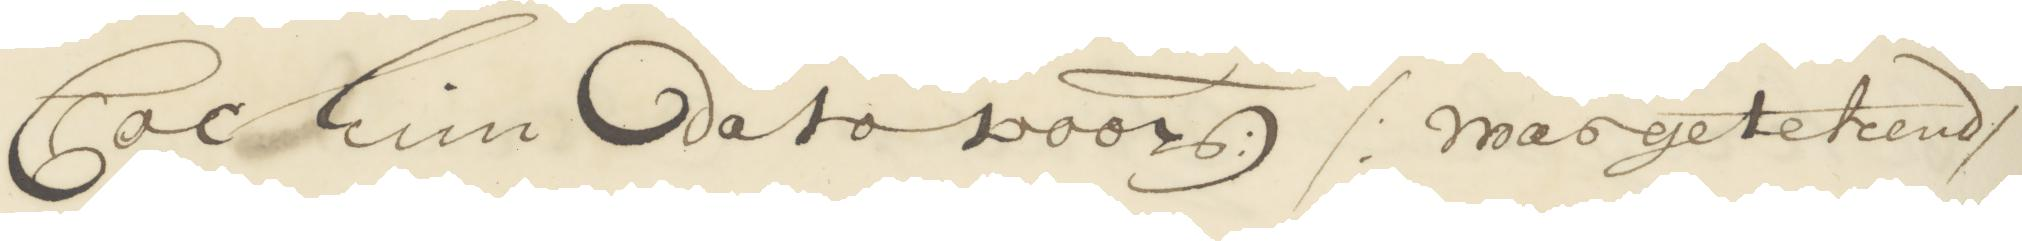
Cochim dato voorlijk /: was getekend:/
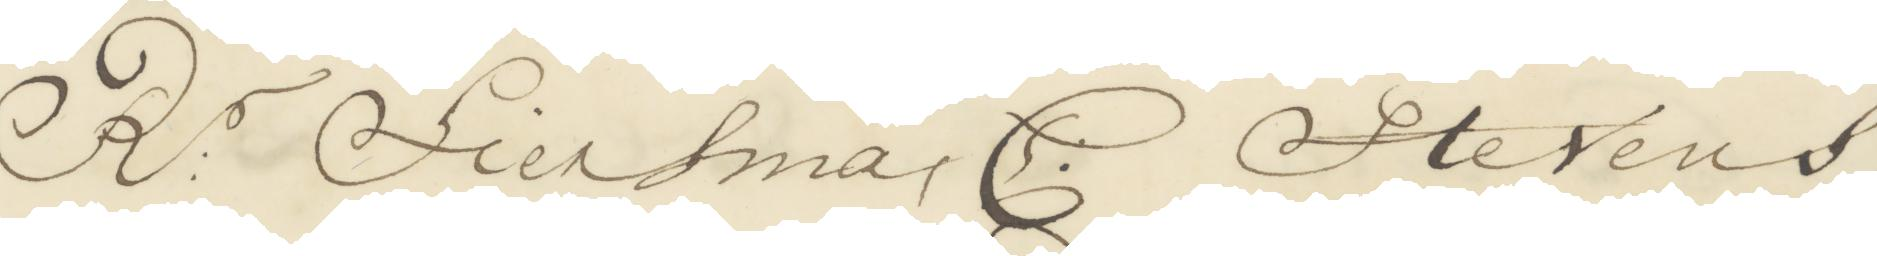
R:s Hiersma, C: Stevens,
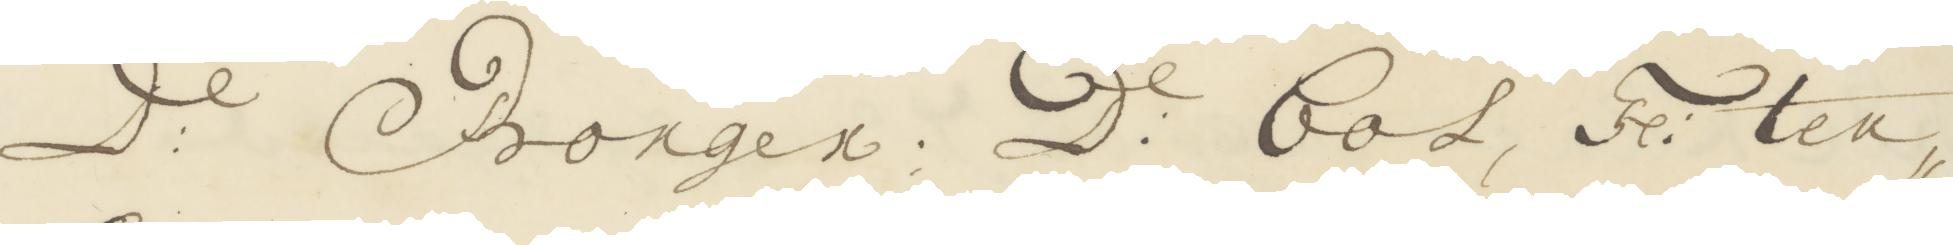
D:e Borger: D:e bol, F: ter„
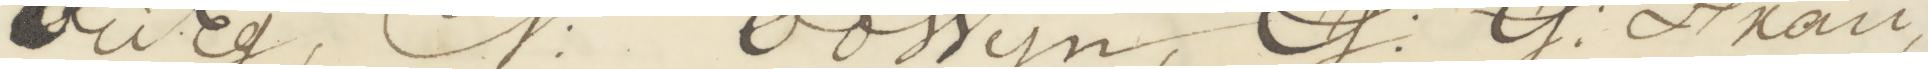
burg, N:s bowijn G: G: Fran„
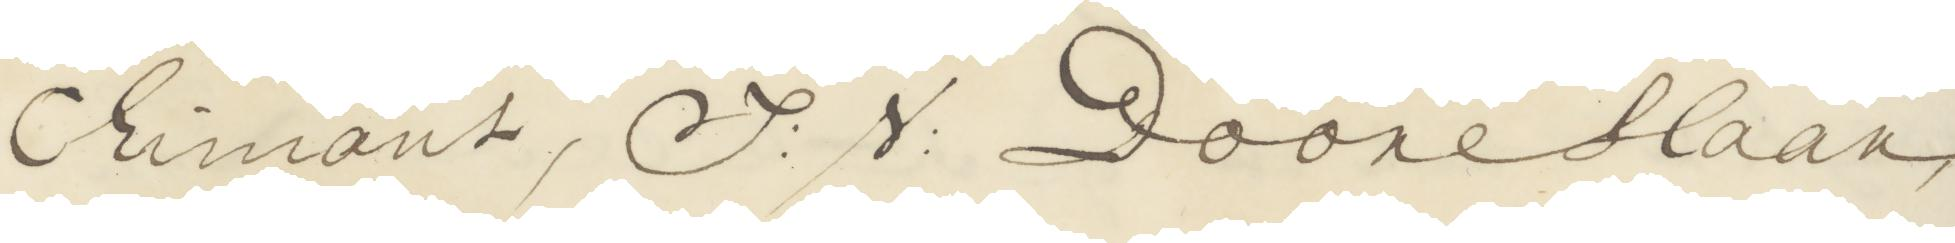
chimont, J: V: Dooreslaar,
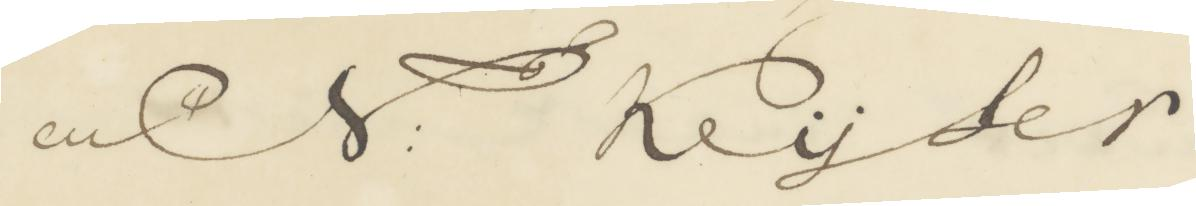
en N:s Keijser
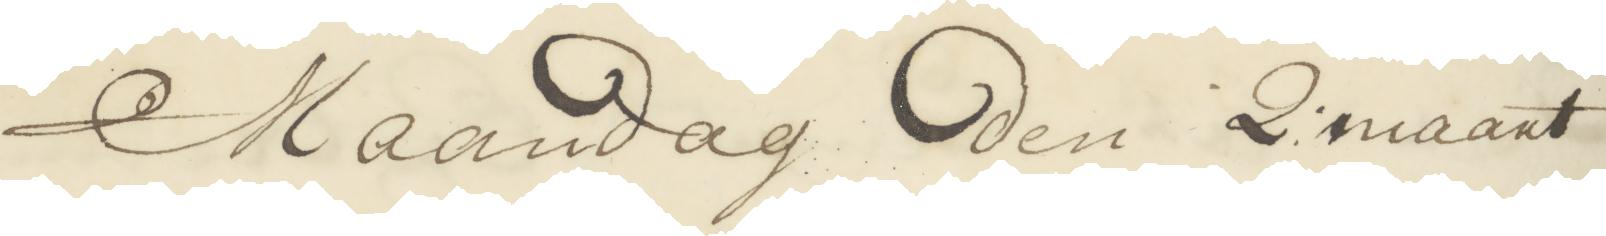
Maandag den 2: maart
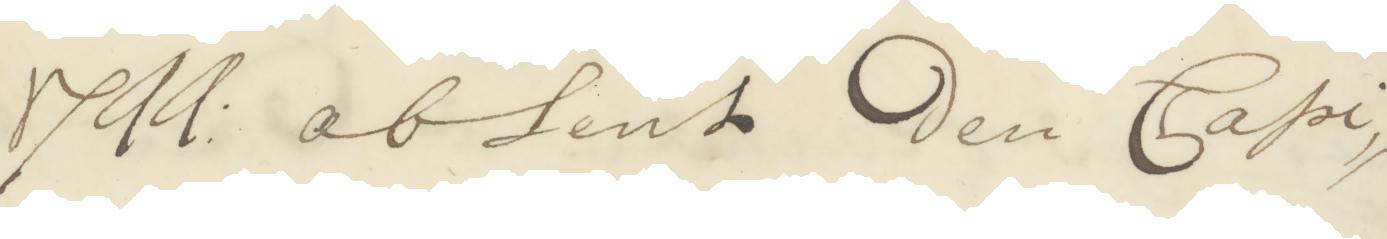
1744: absent den Capi„
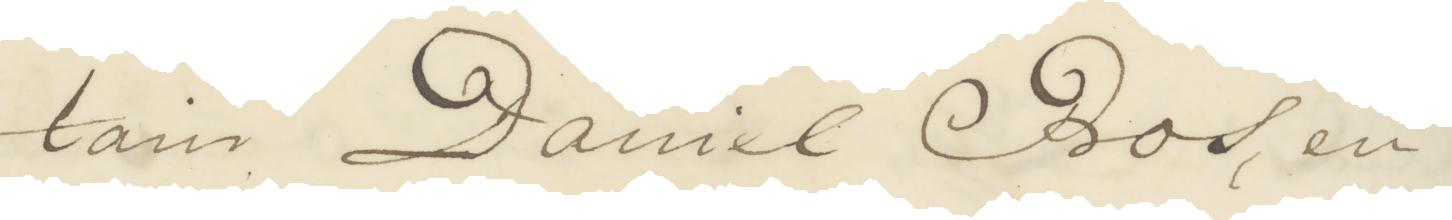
tain Daniel Bos, en
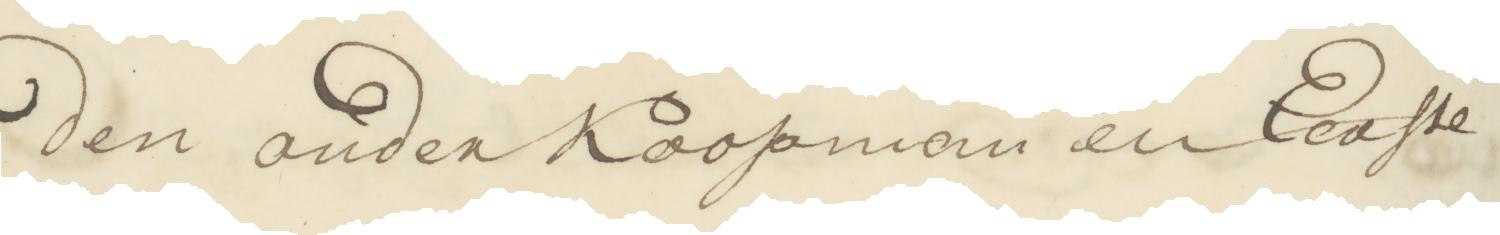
den onderKoopman en Eerste
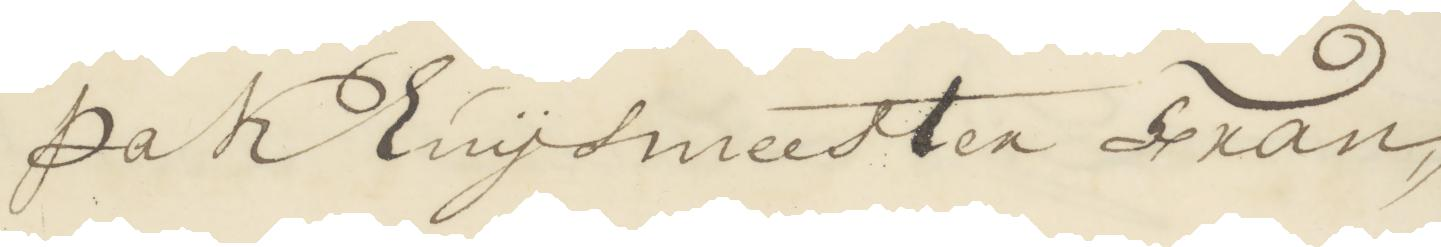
pakhuijsmeester Fran„
